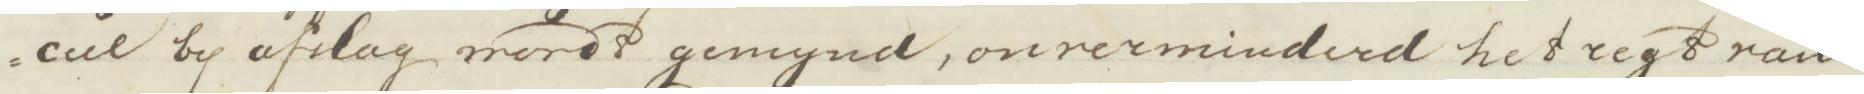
„ceel by afslag wordt gemynd, onverminderd het regt van
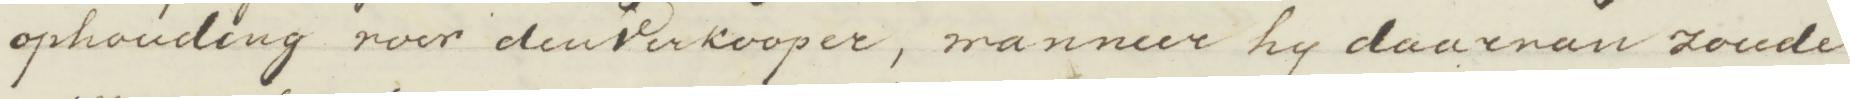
ophouding voor den verkooper, wanneer hy daarvan zoude
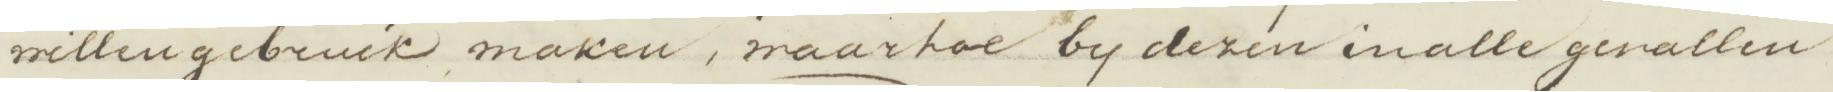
willen gebruik maken, waartoe by dezen in alle gevallen
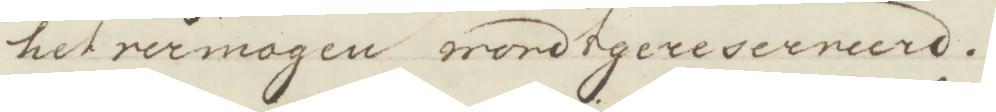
het vermogen wordt gereserveerd.
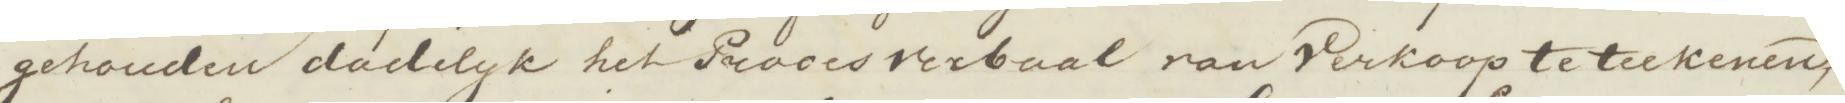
gehouden dadelyk het Proces verbaal van Verkoop te teekenen,
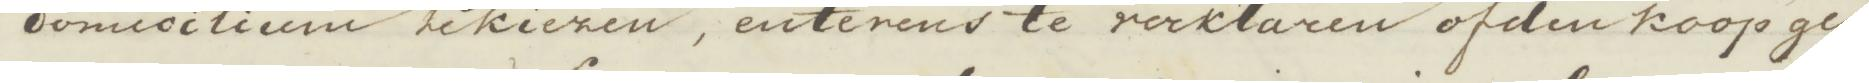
domicilium te kiezen, en tevens te verklaren of den koop ge
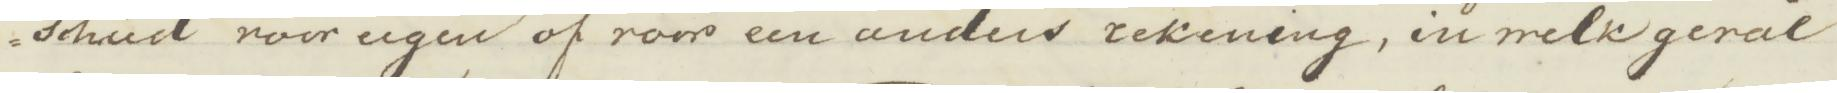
„schied voor eigen of voor een anders rekening, in welk geval
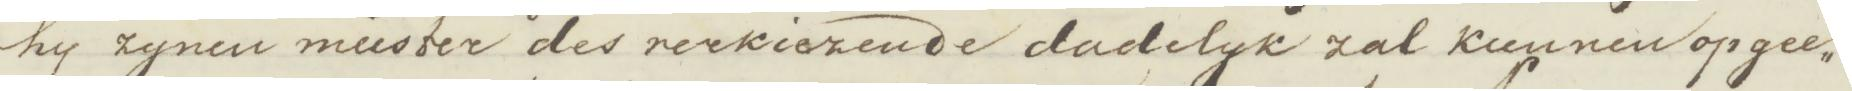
hy zynen meester des verkiezende dadelyk zal kunnen op gee„
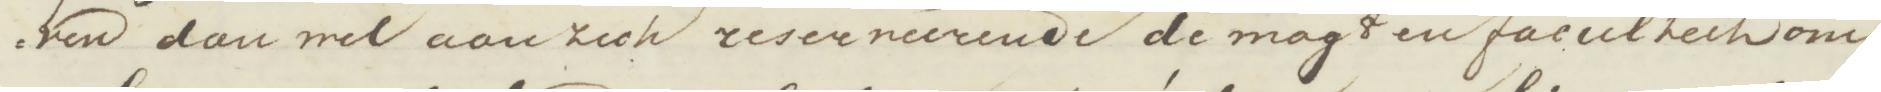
„ven dan wel aan zich reserveerende de magt en faculteit om
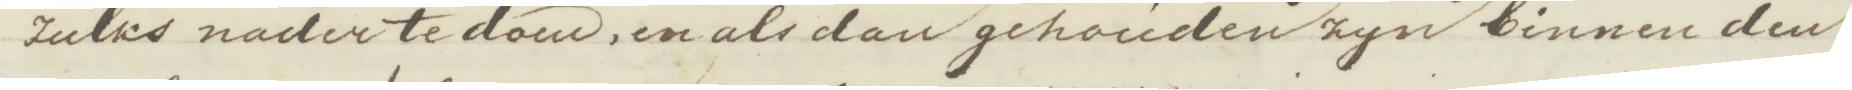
zulks nader te doen, en als dan gehouden zyn binnen den
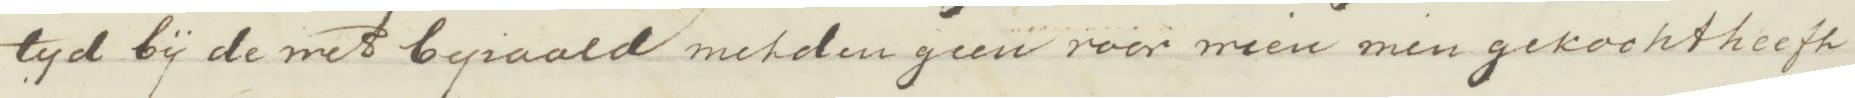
tyd bij de wet bepaald met den geen voor wien men gekocht heeft
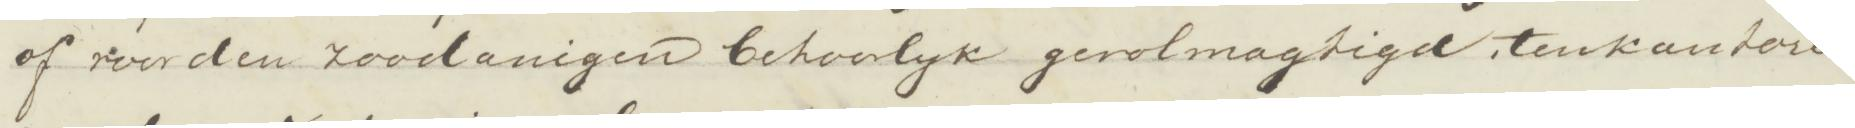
of voor den zoodanigen behoorlyk gevolmagtigd, ten kantore
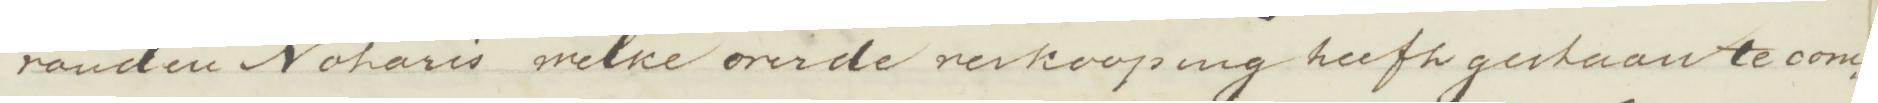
van den Notaris welke over de verkooping heeft gestaan te com„
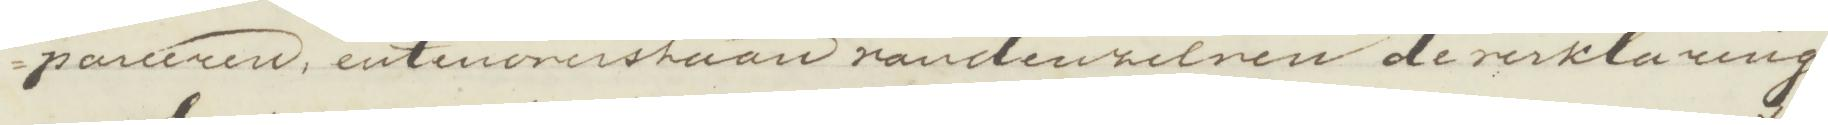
=pareeren, en ten overstaan van denzelven de verklaring
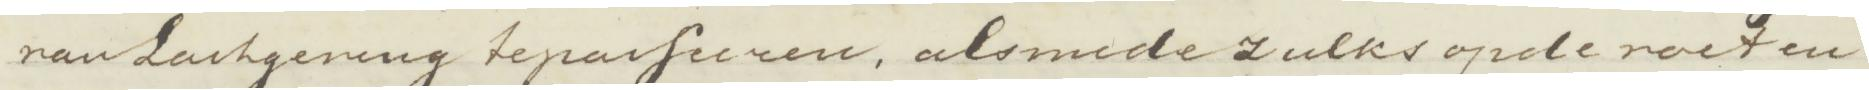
van Lastgeving te passeeren, als mede zulks op de voet en
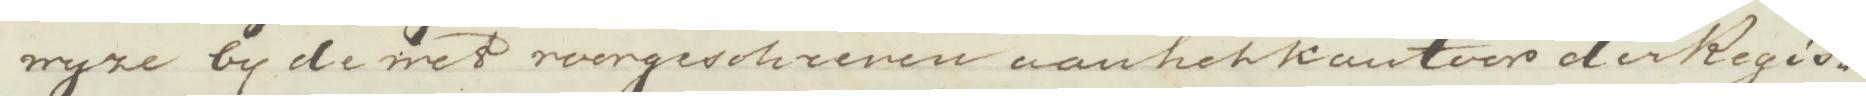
wyze by de wet voorgeschreven aan het kantoor der Regis„
